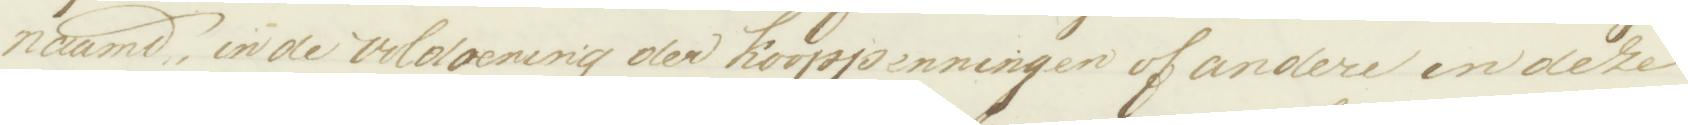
naamd, in de voldoening der Kooppenningen of andere in deze
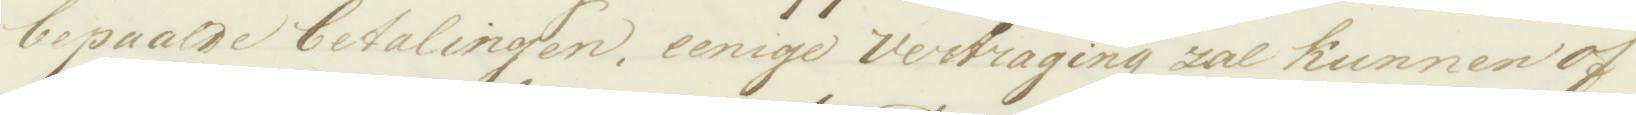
bepaalde betalingen, eenige vertraging zal kunnen of
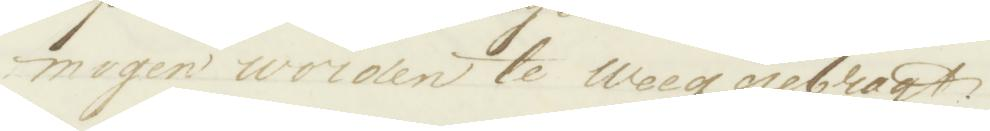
mogen worden te weeg gebragt.
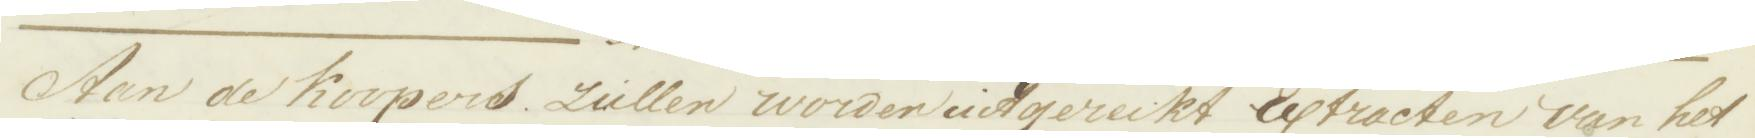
Aan de koopers, zullen worden uitgereikt Extracten van het
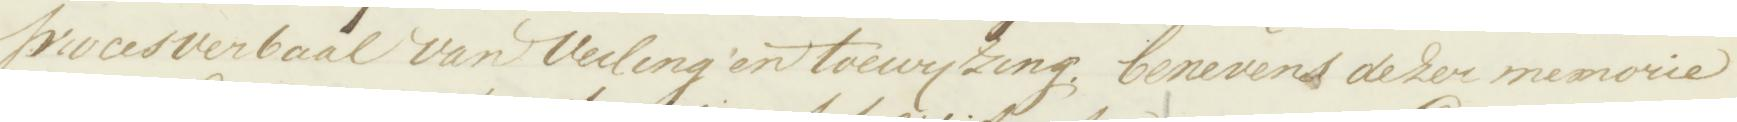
procesverbaal van Veiling en toewyzing, benevens dezer memorie
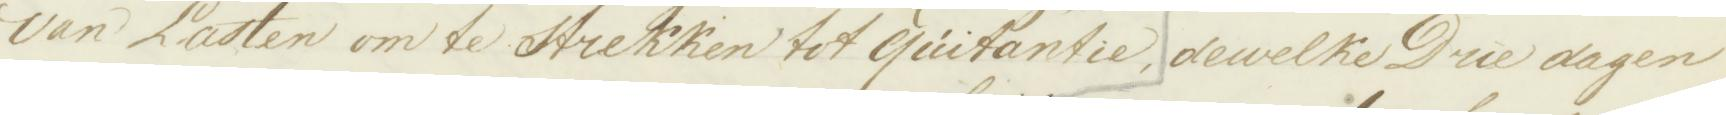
van Lasten om te strekken tot quitantie,] dewelke Drie dagen
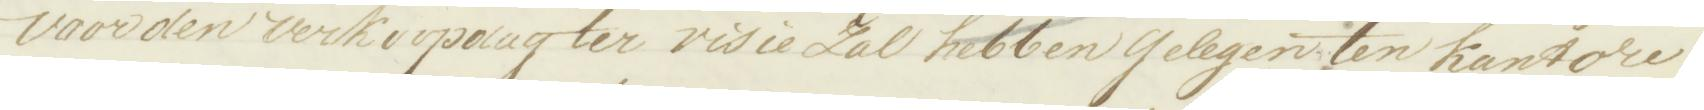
voor den verkoopdag ter visie zal hebben gelegen ten kantore
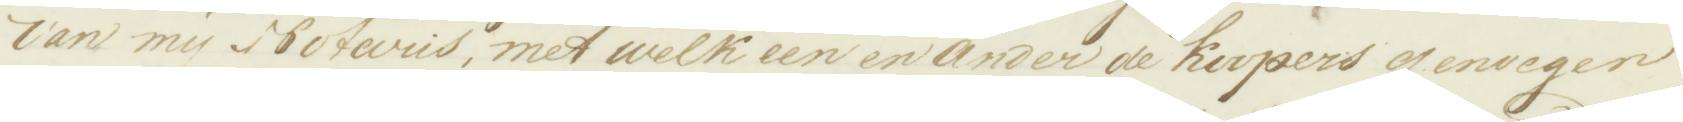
van mij Notaris, met welk een en ander de kopers genoegen
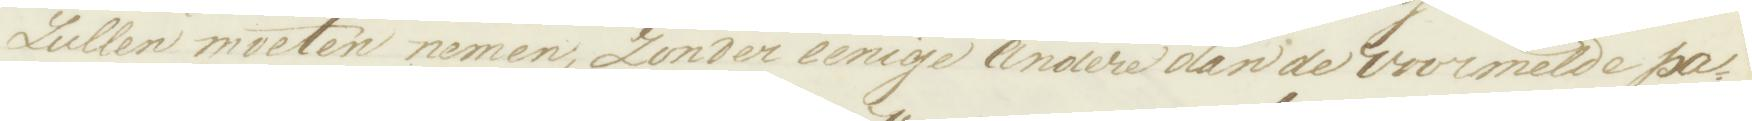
zullen moeten nemen, zonder eenige andere dan de voormelde pa„
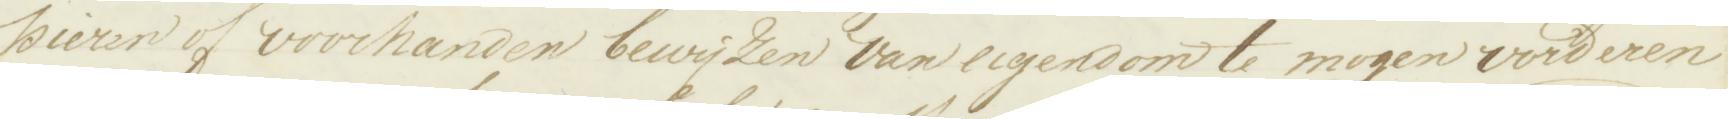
pieren of voorhanden bewijzen van eigendom te mogen vorderen
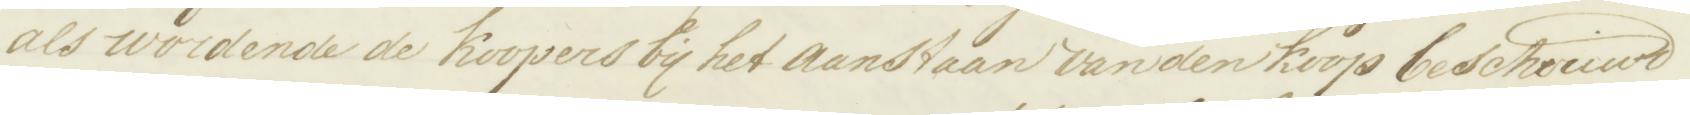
als wordende de Koopers bij het aanstaan van den koop beschouwd
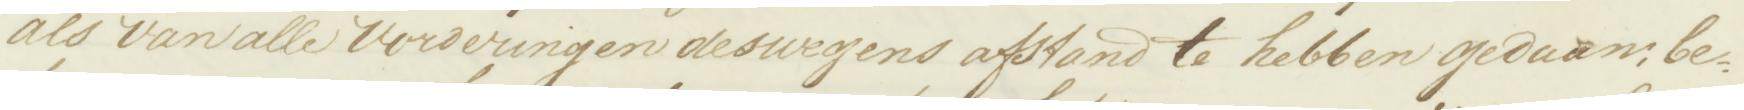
als van alle vorderingen deswegens afstand te hebben gedaan; be„
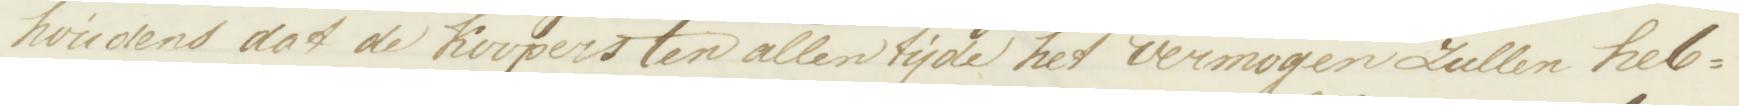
houdens dat de koopers ten allen tijde het vermogen zullen heb=
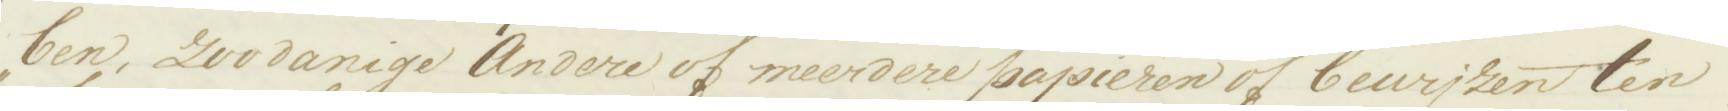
ben, zoodanige Andere of meerdere papieren of bewijzen ten
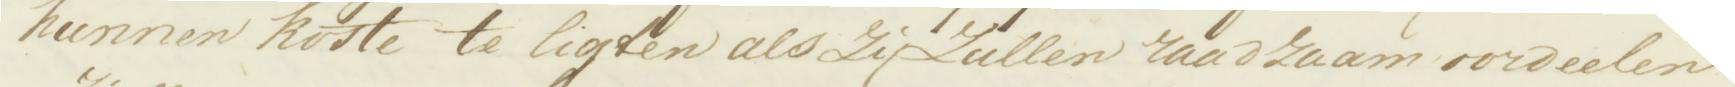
hunnen koste te ligten als zij zullen raadzaam oordeelen
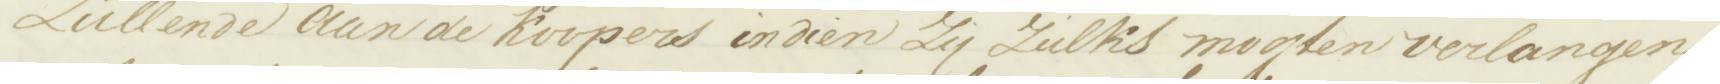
zullende aan de koopers indien zij zulks mogten verlangen
